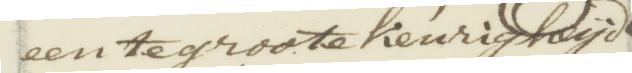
een te groote keurigheijd
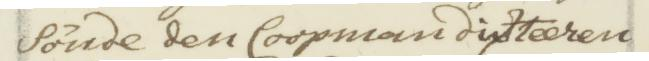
soude den Coopman diverteeren
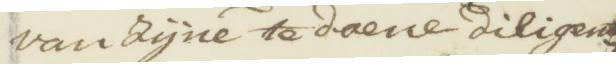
van zijne te doene diligent
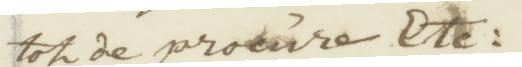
tot de procure Etc :
